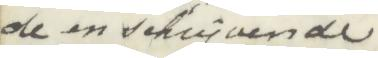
de en schrijvende
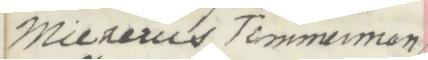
Miezerus, Timmerman
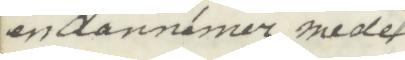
en Aannemer, mede
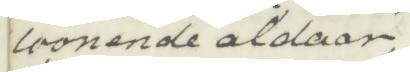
wonende aldaar,
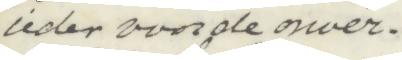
ieder voor de onver.
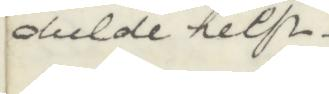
deelde helft-
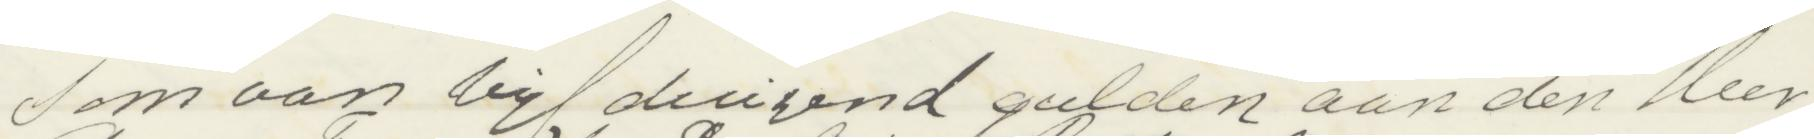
som van vijf duizend gulden aan den Heer
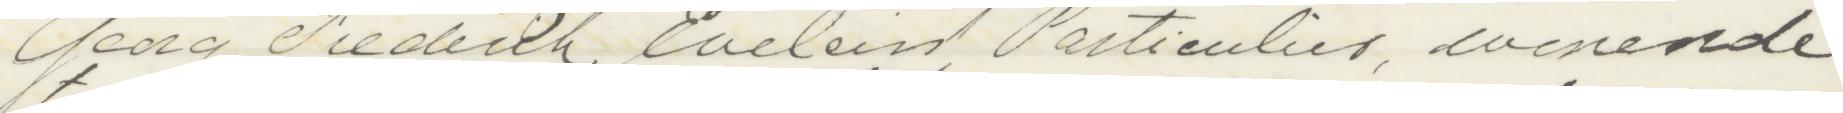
Georg Frederik Evelein, Particulier, wonende
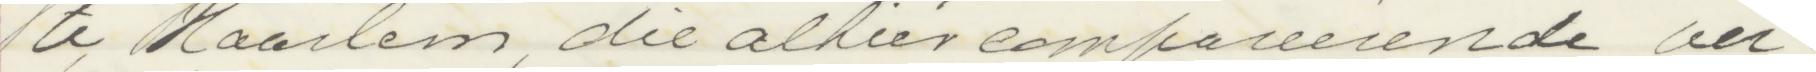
te Haarlem, die alhier compareerende ver-
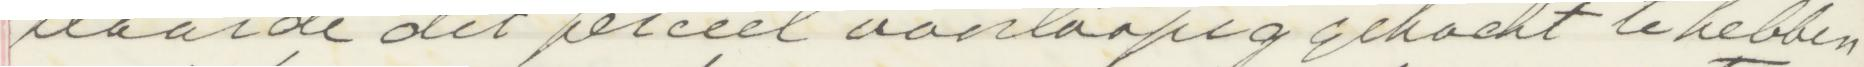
klaarde dit perceel voorloopig gekocht te hebben
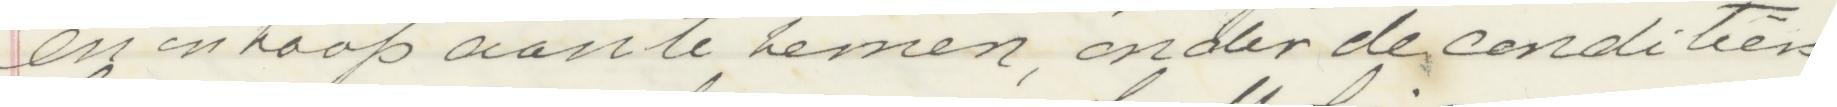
en in koop aan te nemen, onder de conditiën
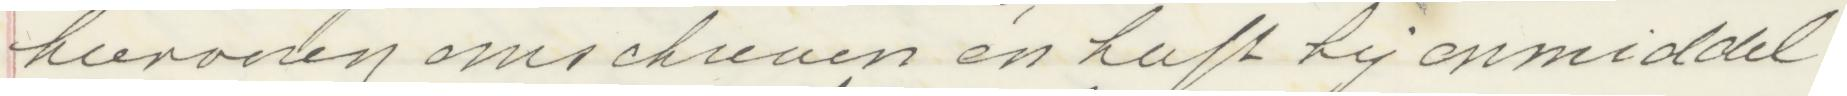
hiervoren omschreven en heeft hy opmiddel-
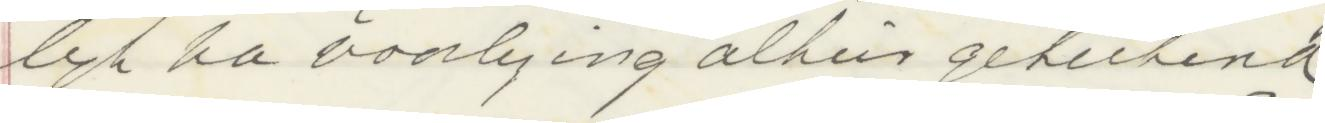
lyk na voorlezing alhier geteekend
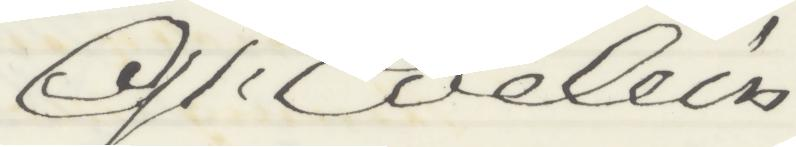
GF Evelein
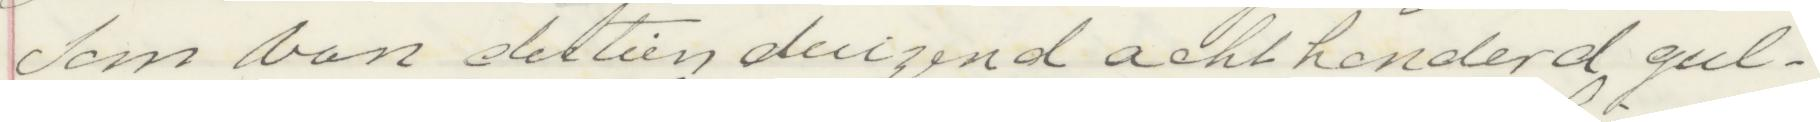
Som van dertien duizend acht honderd gul-
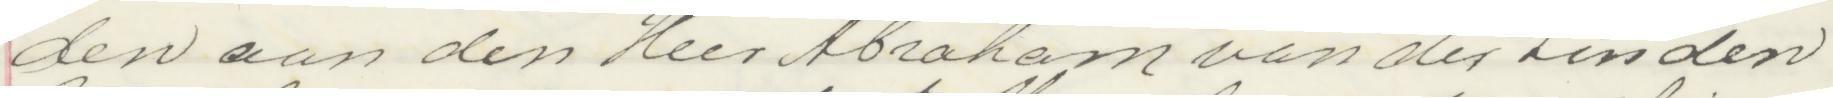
den aan den Heer Abraham van der Linden
